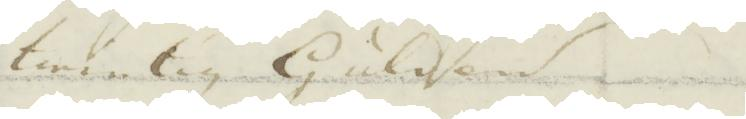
twintig Gulden
